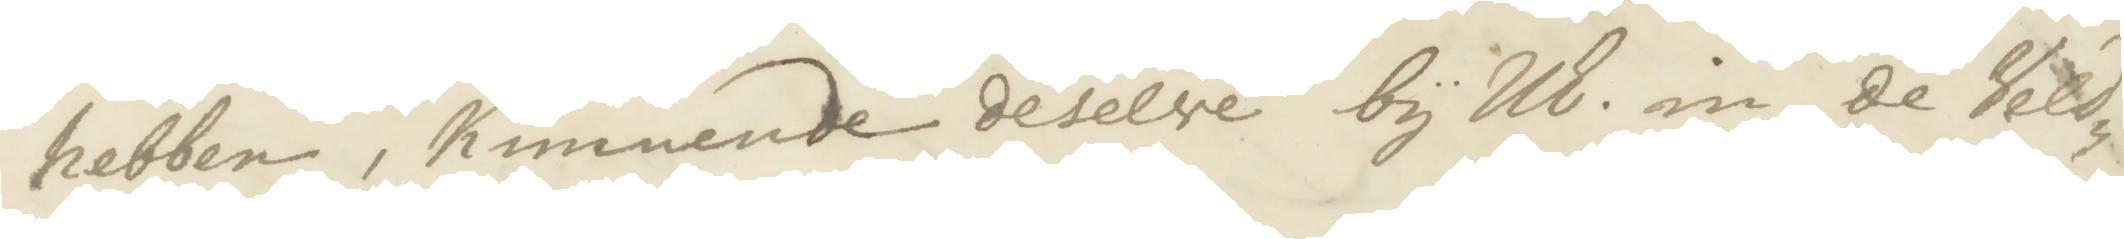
hebben, kunnende deselve bij UE. in de Veld„
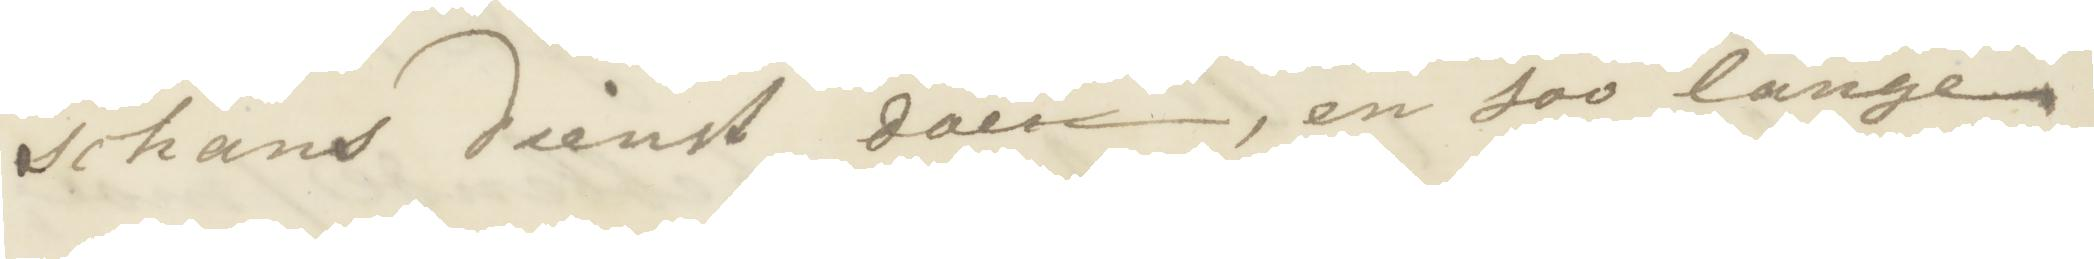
schans dienst doen, en soo lange
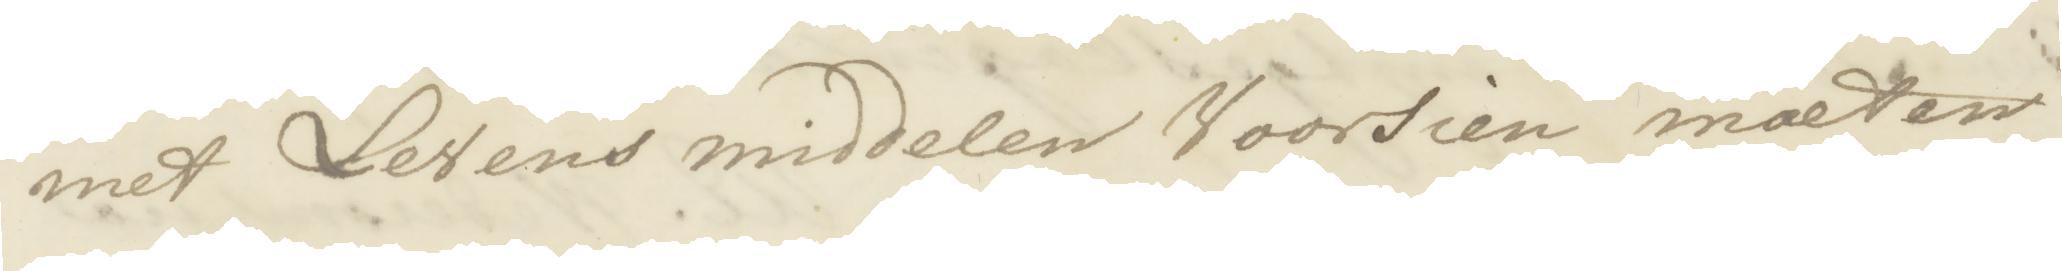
met Levens middelen Voorsien moeten
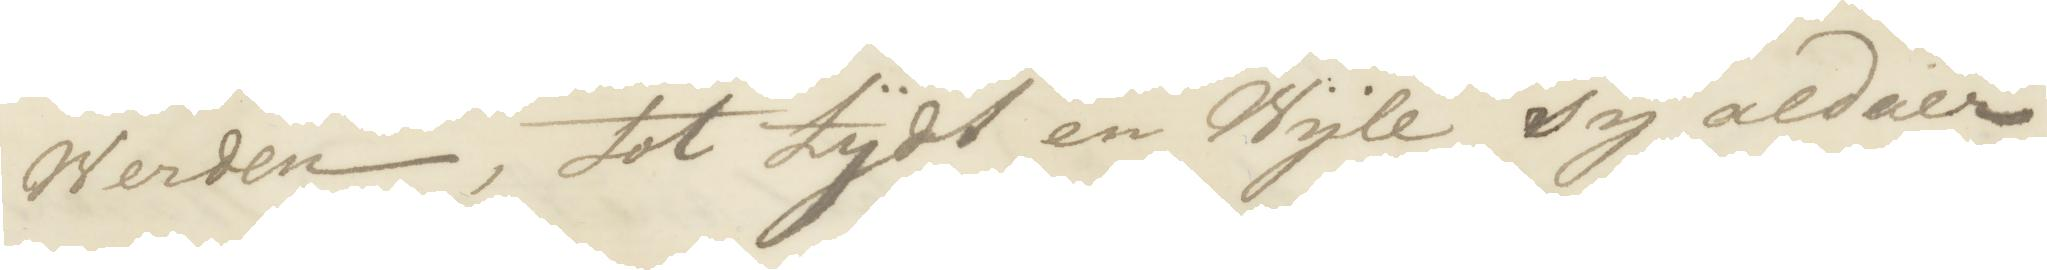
werden, tot tijds en wijle sij aldaer
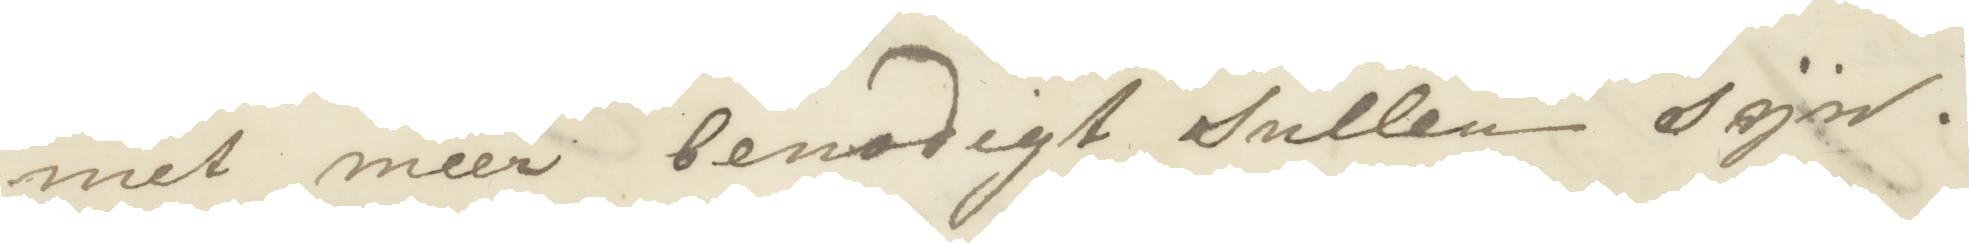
niet meer benodigt sullen sijn.
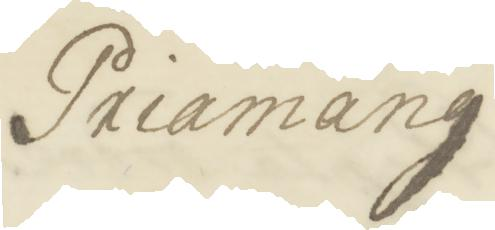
Priamang
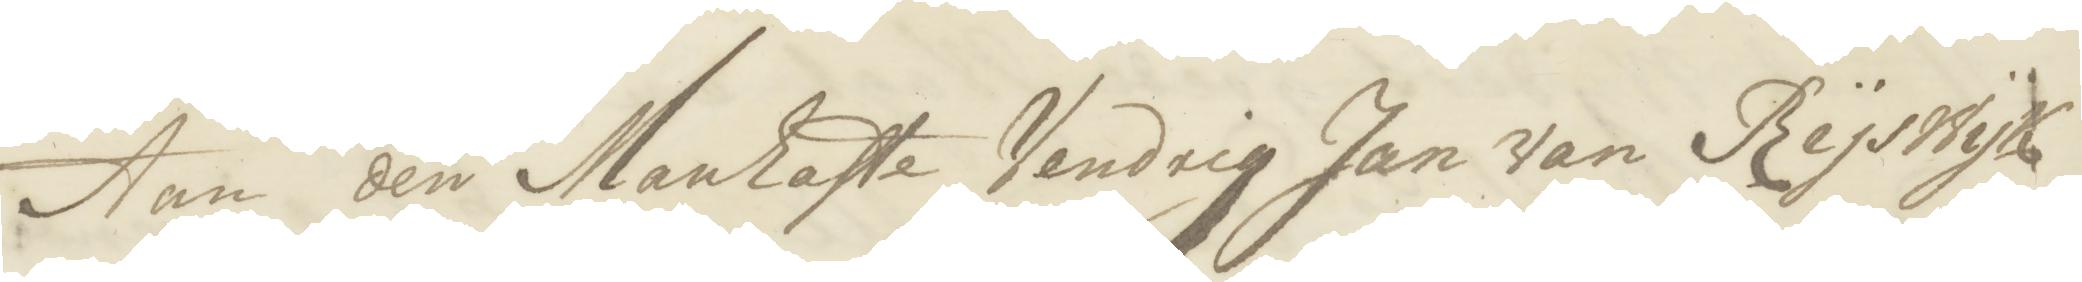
Aan den Manhafte Vendrig Jan van Rejswijk
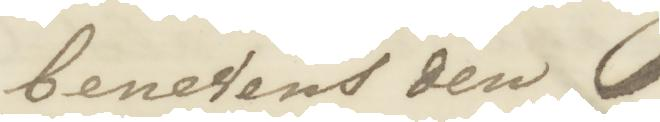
benevens den
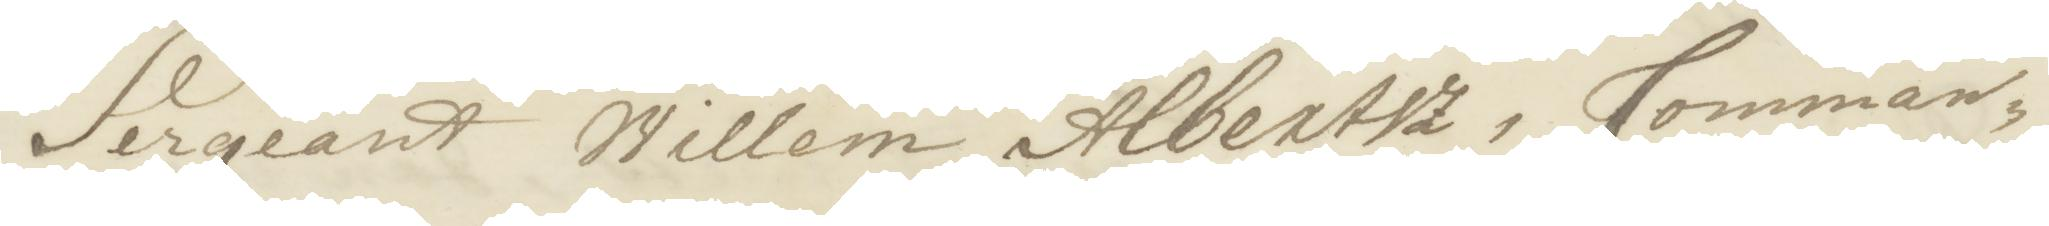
Sergeant Willem Albertsz, Comman„
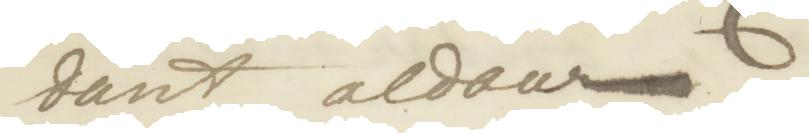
dant aldaar.
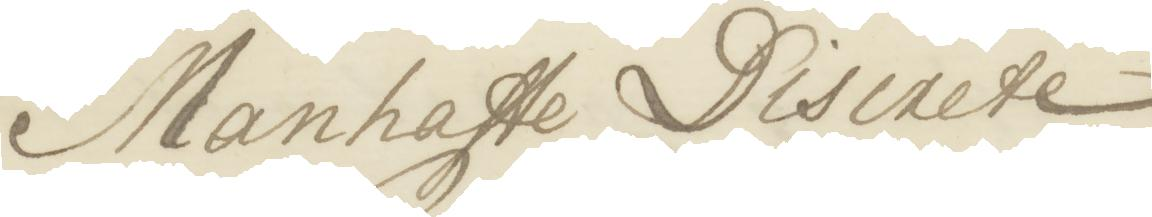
Manhafte Discrete.
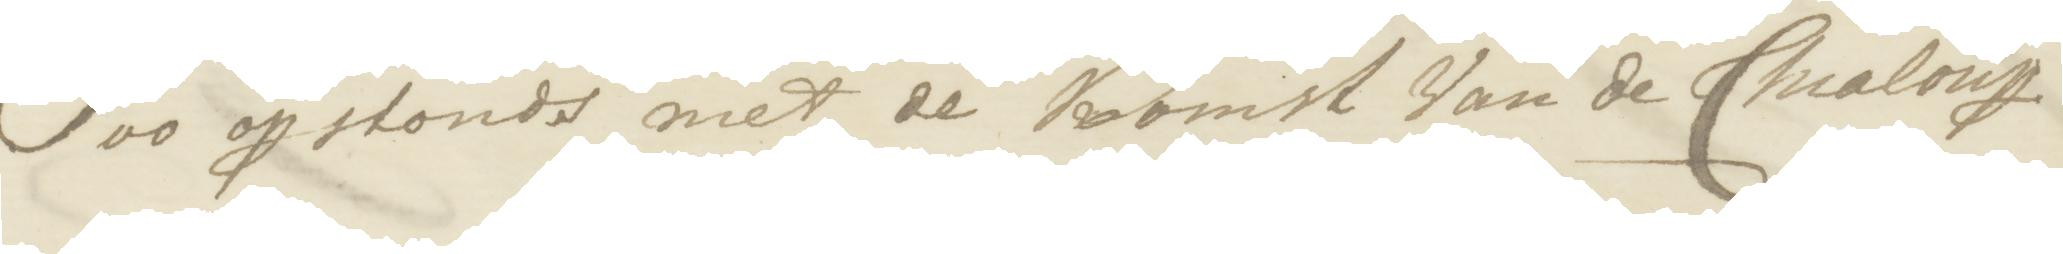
Soo opstonds met de komst van de Chialoup
